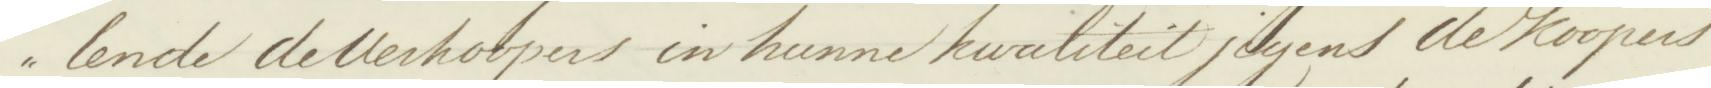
„ lende de verkoopers in hunne kwaliteit jegens deKoopers
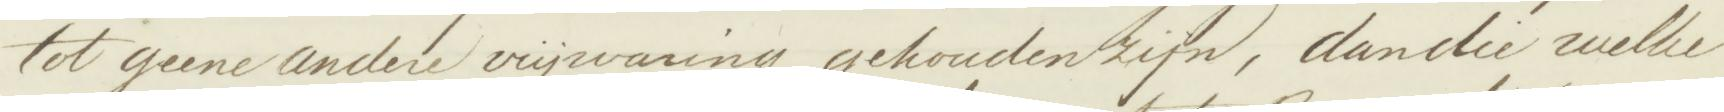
tot geene andere vrijwaring gehouden zijn, dandie welke
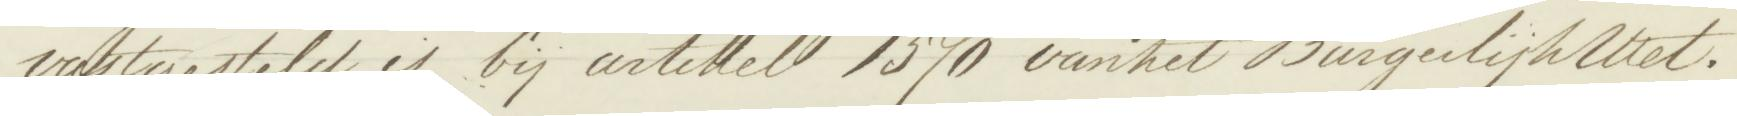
vastgesteld is bij artikel 1570 van het Burgerlijk Wet.
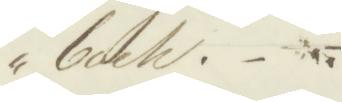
„ boek. —.
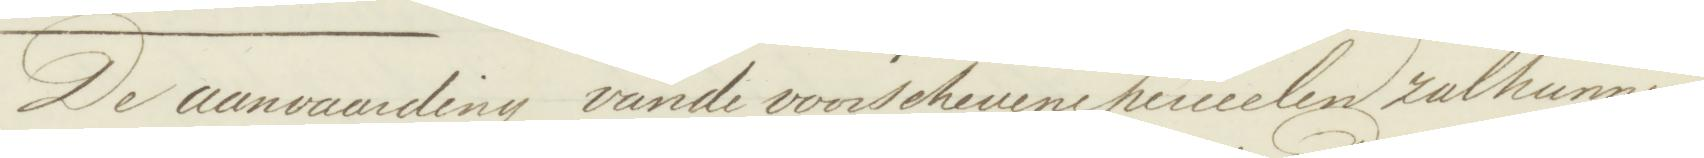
De aanvaarding vande voorschevene perceelen zalkunnen
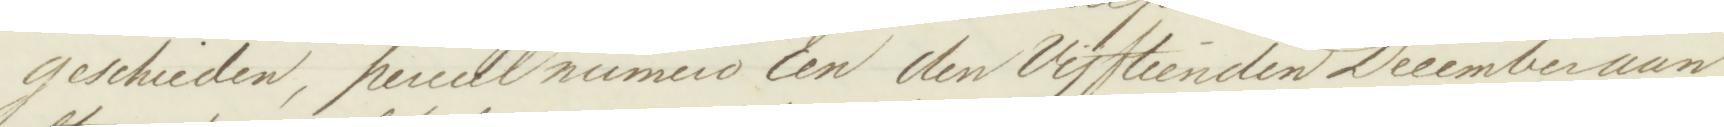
geschieden, perceel numero Een den Vijftienden December aan
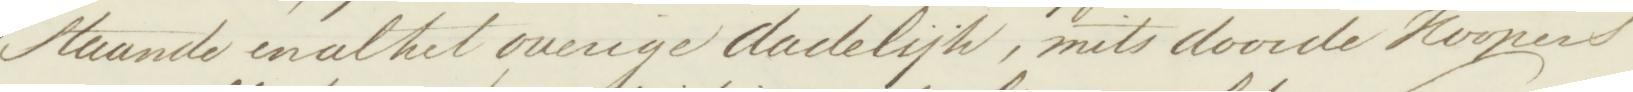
staande en alhet overige dadelijk, mits doorde Koopers
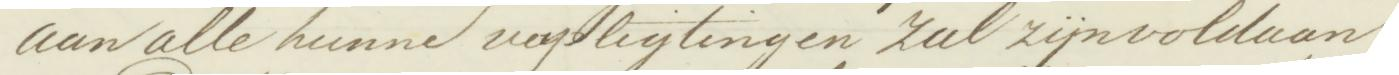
aan alle hunne verpligtingen zal zijnvoldaan
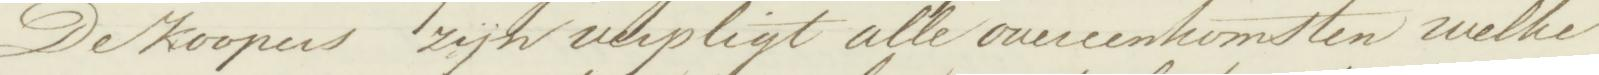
De koopers zijn verpligt alle overeenkomsten welke
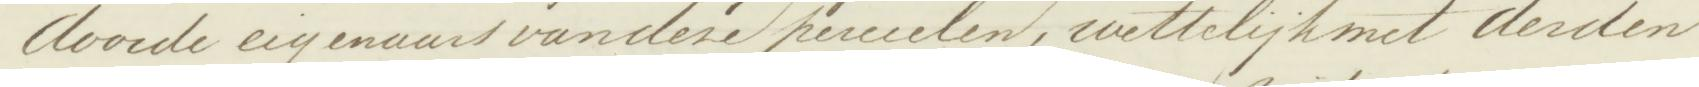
doorde eigenaars van deze perceelen, wettelijk met derden
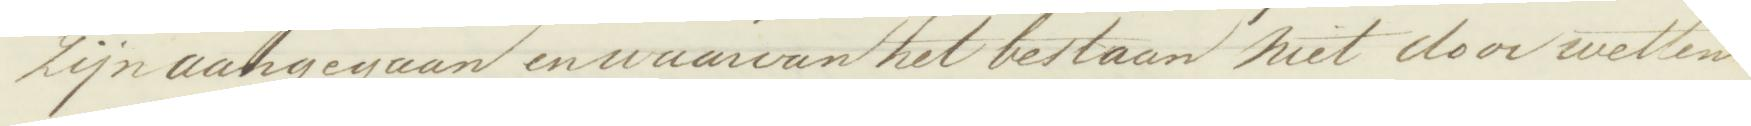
zijn aangegaan en waarvan het bestaan niet door wetten
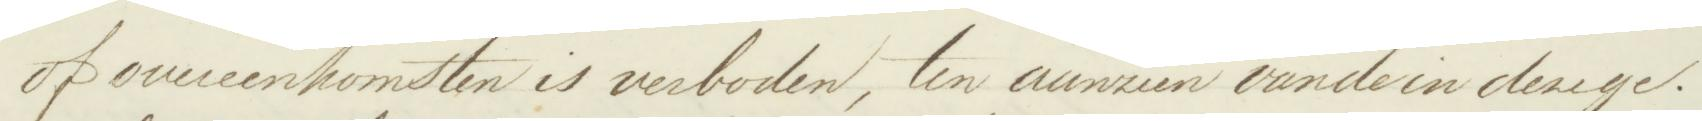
of overeenkomsten is verboden, ten aanzien vande in deze ge.
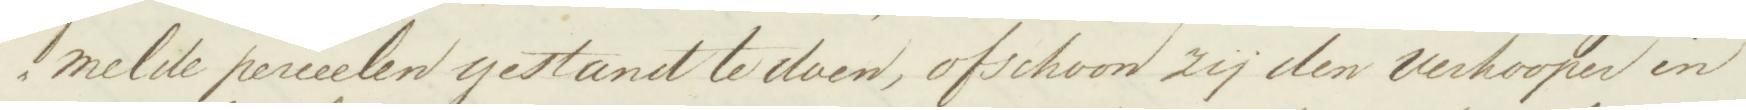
„melde perceelen gestand te doen, ofschoon zij den verkooper in
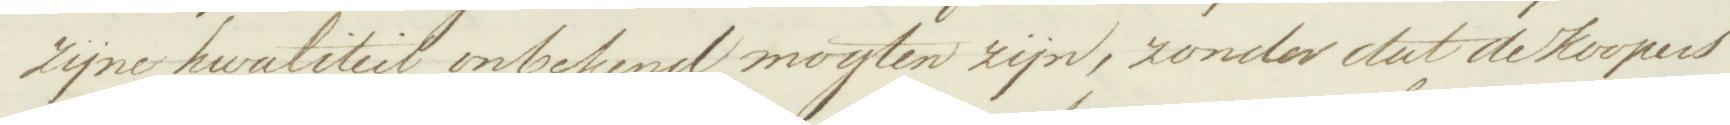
zijne kwaliteit onbekend mogten zijn, zonder dat deKoopers
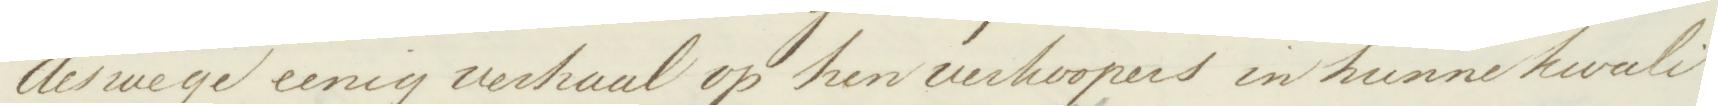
deswege eenig verhaal op hen verkoopers in hunne kwali.
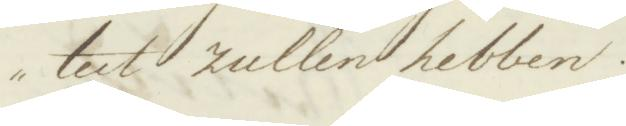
„ teit zullen hebben
